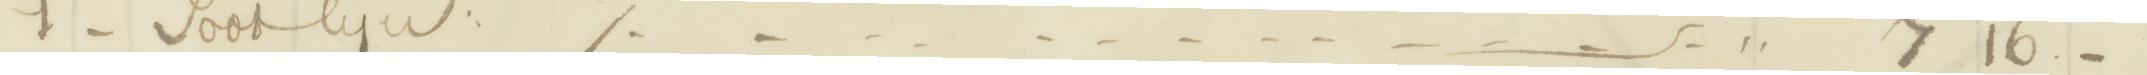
1 - soot lijn: - - - - - - - - - - - - —: ' „ 7 16 —
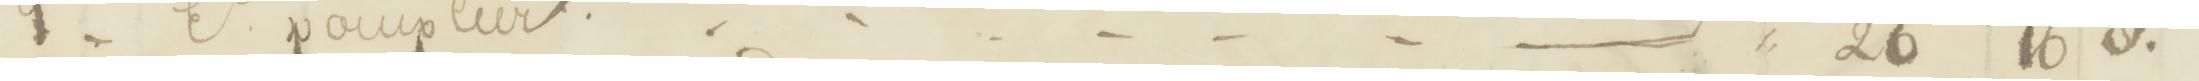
1 - E:d pompleer- - - - - - - - —:' „ 26 16 8.
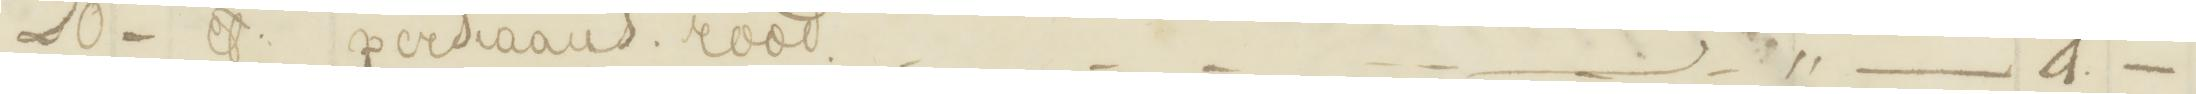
20 - lb: persiaans. rood. - - - - - - —: ' „ — 4. —
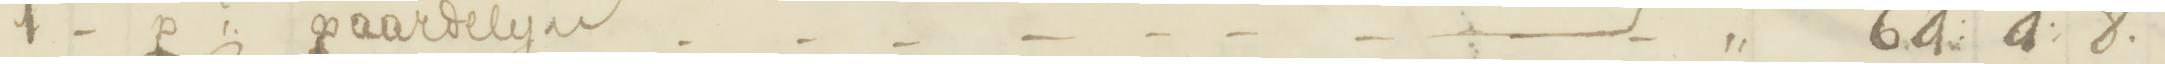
1 - p:s paardelijn - - - - - - - - —:' „ 64: 4: 8.
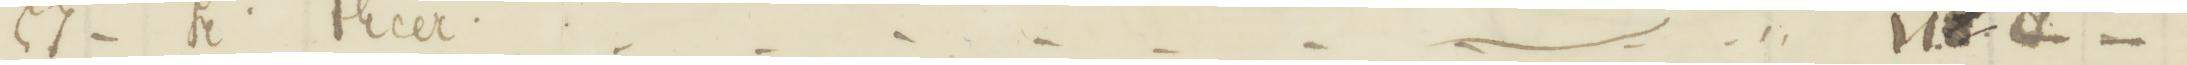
57 — k. theer. . - - - - - - —:' „ 11. 8 —
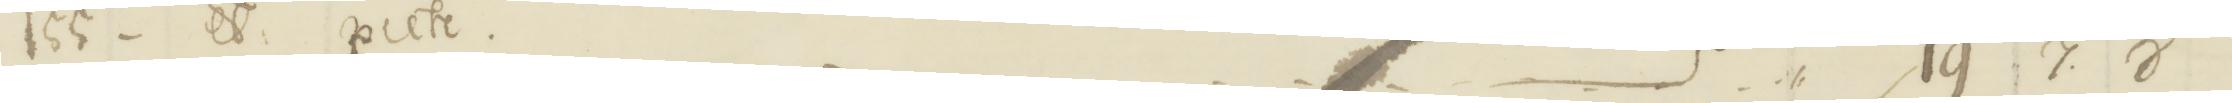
155 — lb: piek. - - - - - - —:' „ 19 7 8
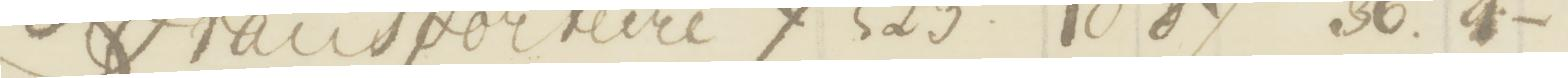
Transporteere ƒ 523: 10 8 ƒ 36. 4. —.
